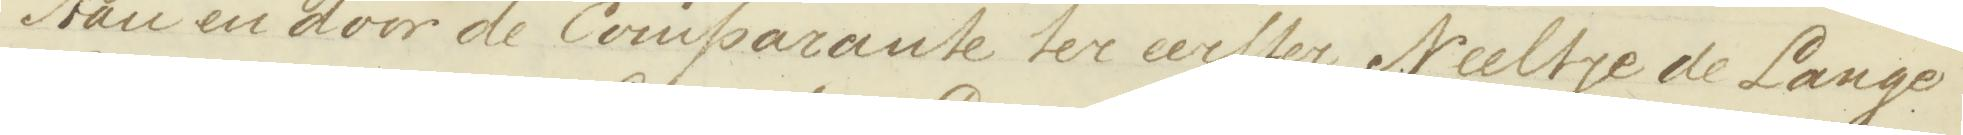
Aan en door de Comparante ter eerster Neeltje de Lange
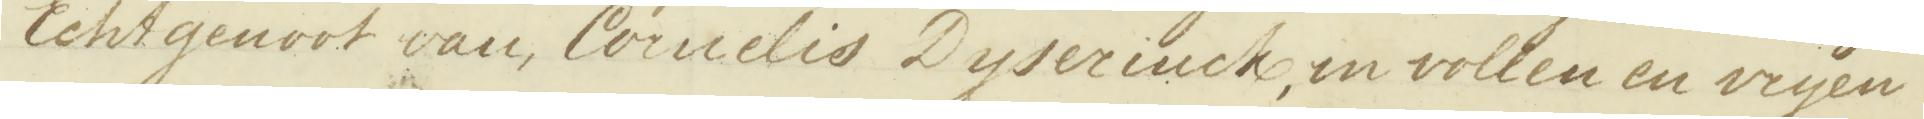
Echtgenoot van, Cornelis Dysterinck, in vollen en vrijen
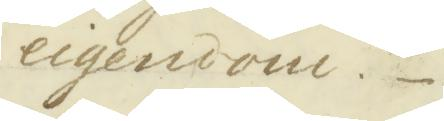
eigendom.
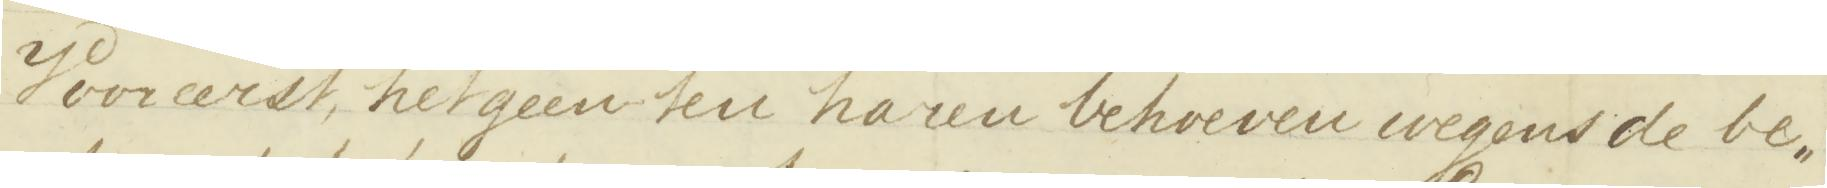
Vooreerst, hetgeen ten haren behoeven wegens de be„
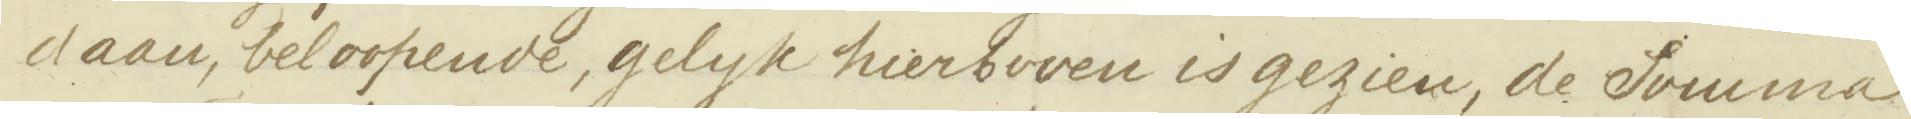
daar, beloopende, gelyk hierboven is gezien, de Somma
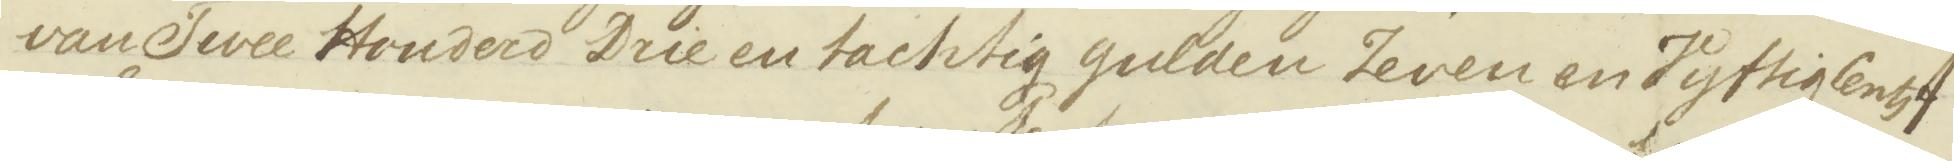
van Twee Honderd Drie en tachtig gulden Zeven en Vyftig Cents
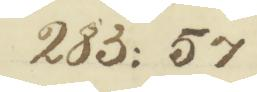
283: 57
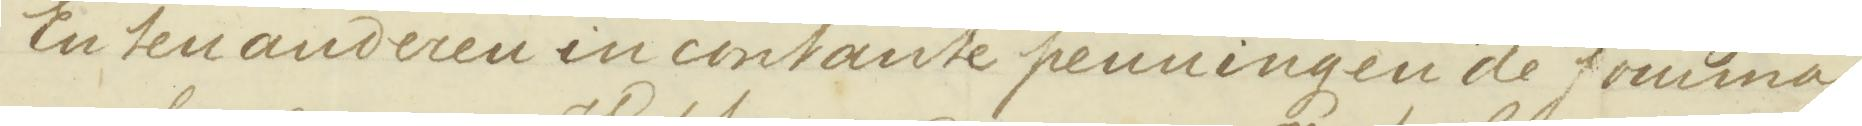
En ten anderen in contante penningen de somma
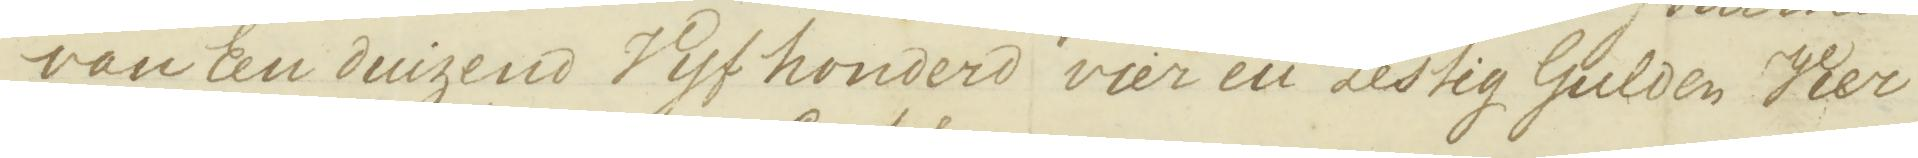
van Een duizend Vyf honderd vier en zestig Gulden Vier
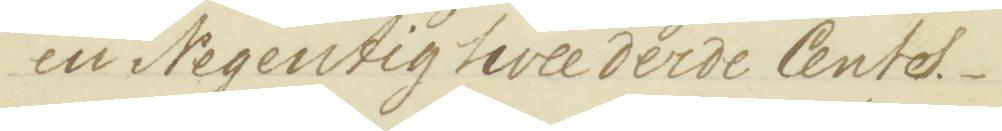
en Negentig twee derde Cents.-
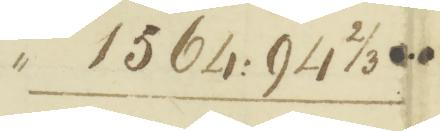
„ 1564:942/3
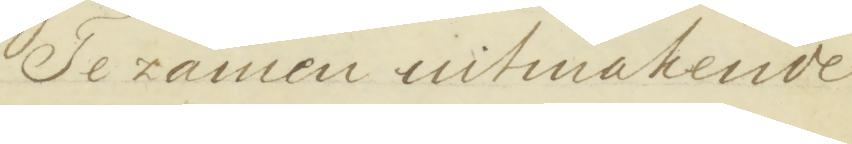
Te zamen uitmakende
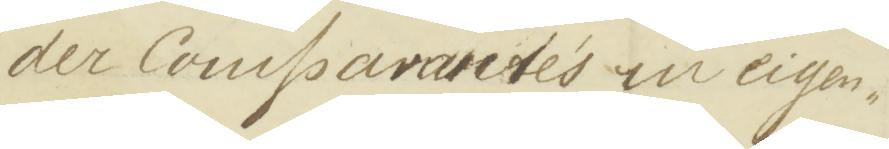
der Comparantes in eigen„
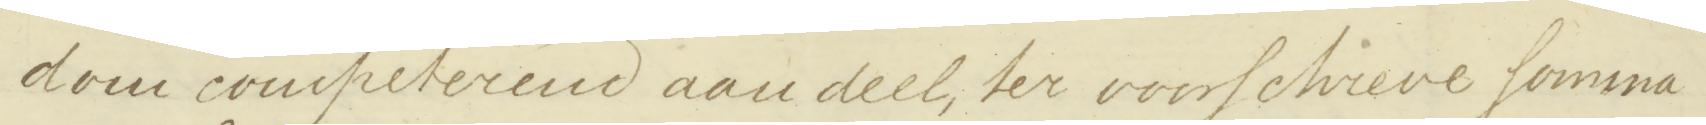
dom competerend aan deel, ter voorschreve somma
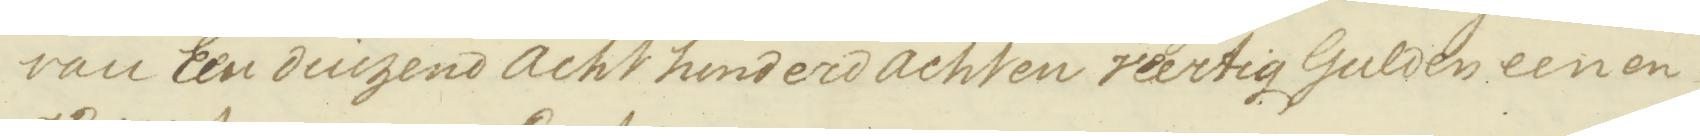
van Een duizend Acht honderd acht en veertig Gulden een en
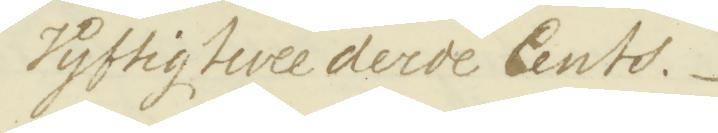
Vyftig twee derde Cents.—
